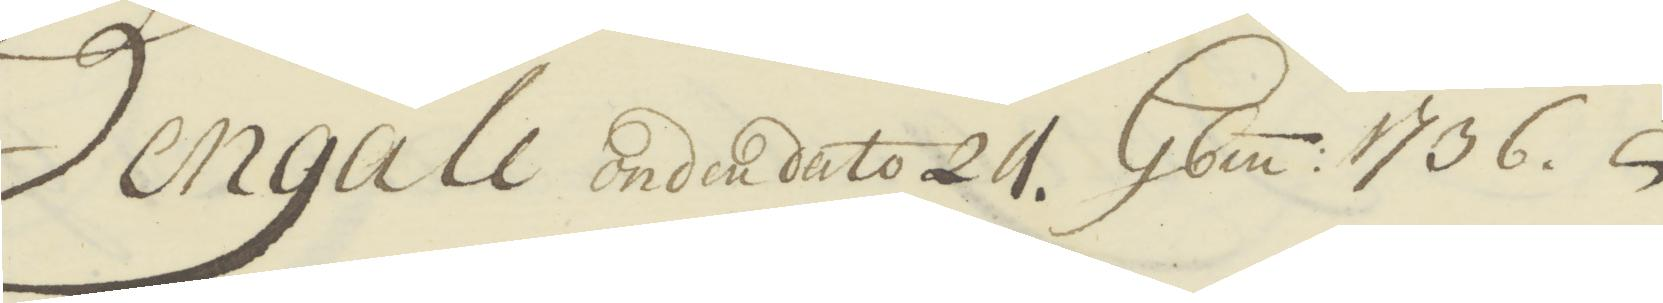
Van Bengale onder dato 24. Gber: 1736.
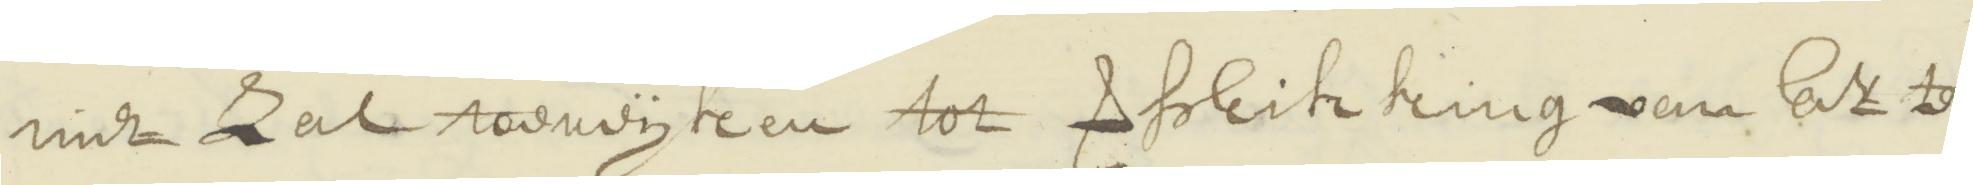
niet zal toereijken tot verschikking van het te
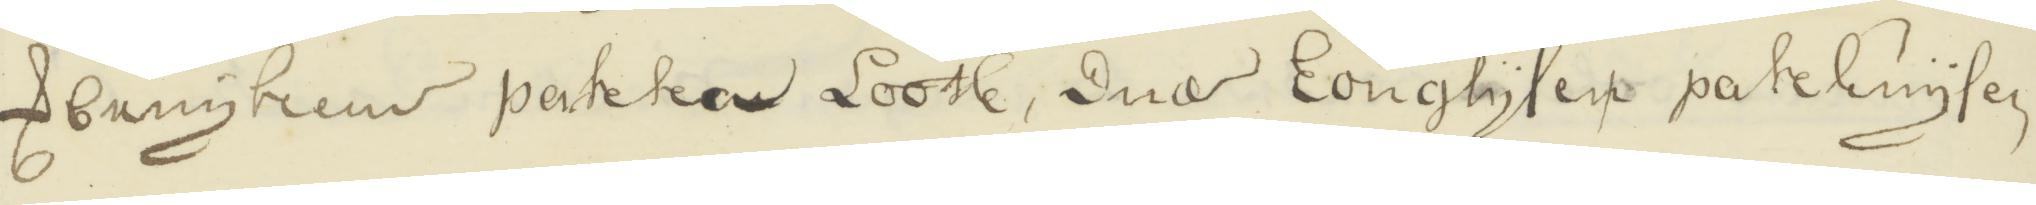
verbruijkene pakka Looth, Ende honglijsen pakhuijsen
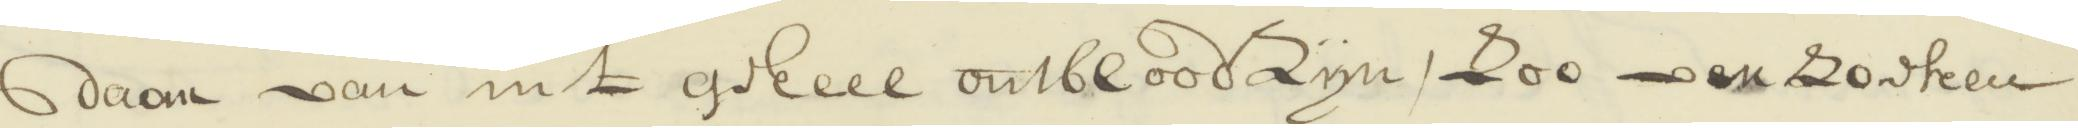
daar van in t geheel ontblood zijn / zoo verzoeken
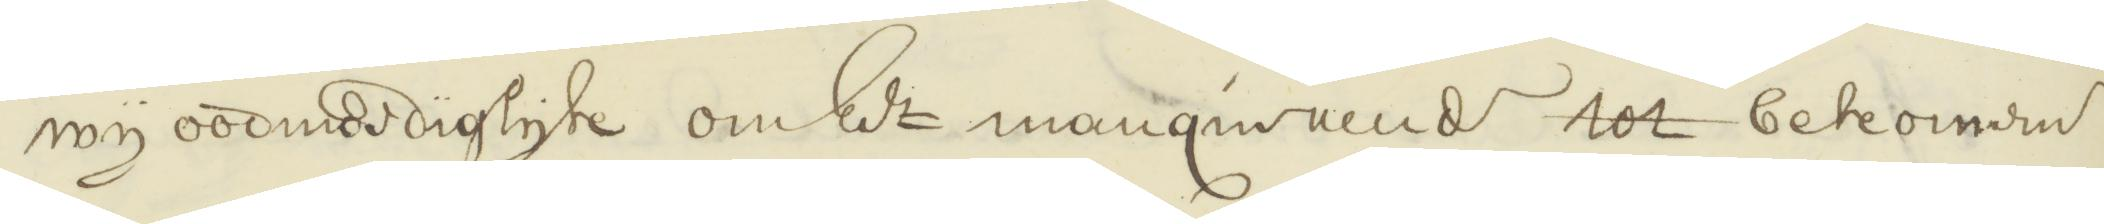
wij oodmoediglijk om het manquerende tot bekomene
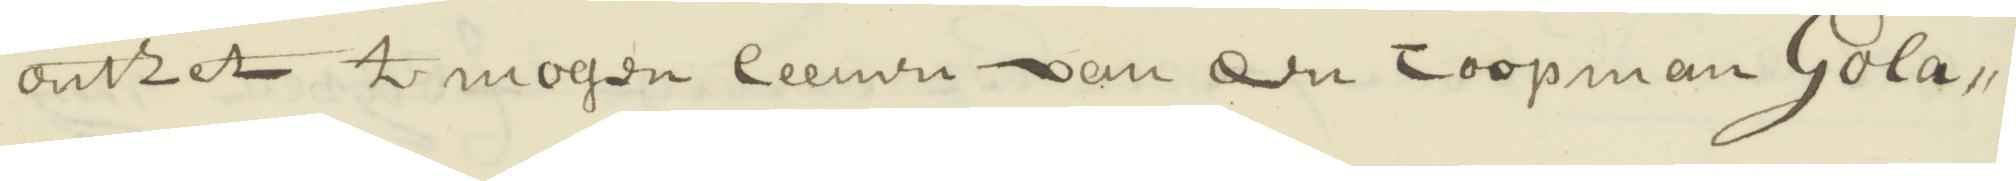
ontzet te mogen leenen van den coopman Gola„
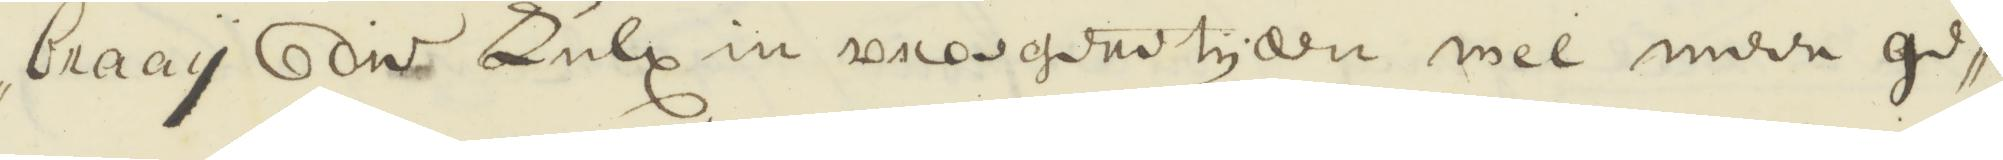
„braaij die zulx in vroegere tijden wel meer ge„
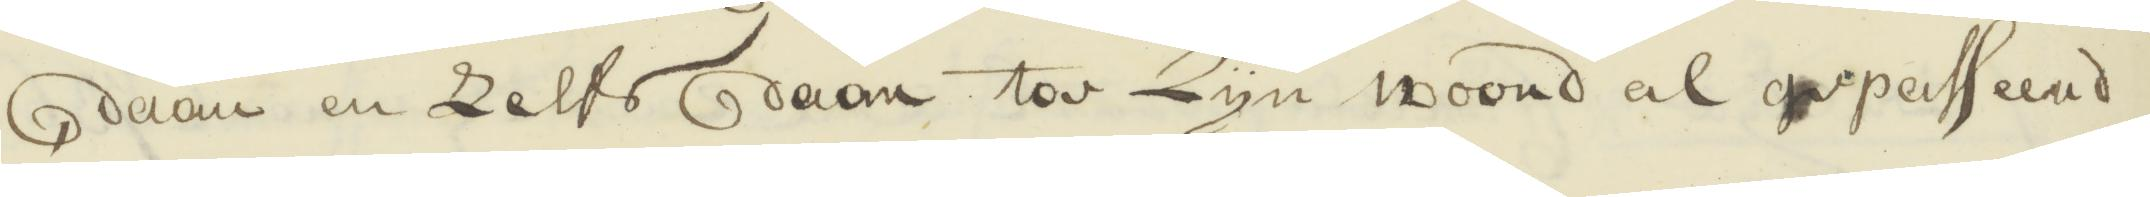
,daan en zelfs daar toe zijn woord al gepasseerd
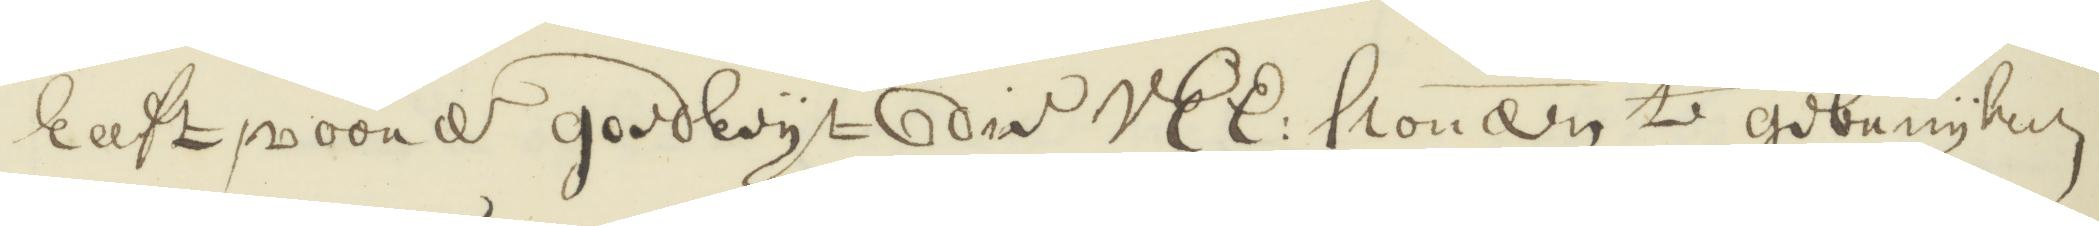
heeft, voor de goedheijt die VEE: stonden te gebruijken
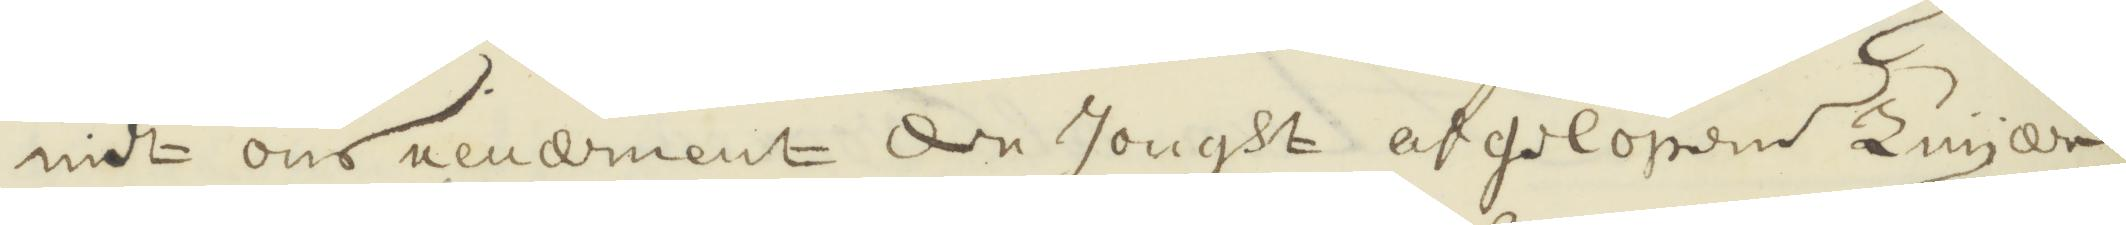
niet ons rendement den Jongst afgelopene zuijder
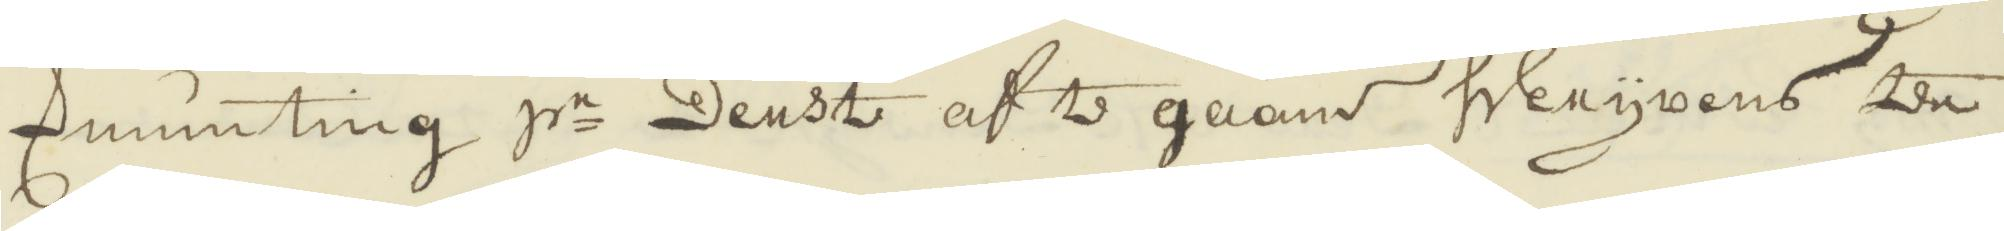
vermunting p=r Eerst af te gaane schrijvens ter
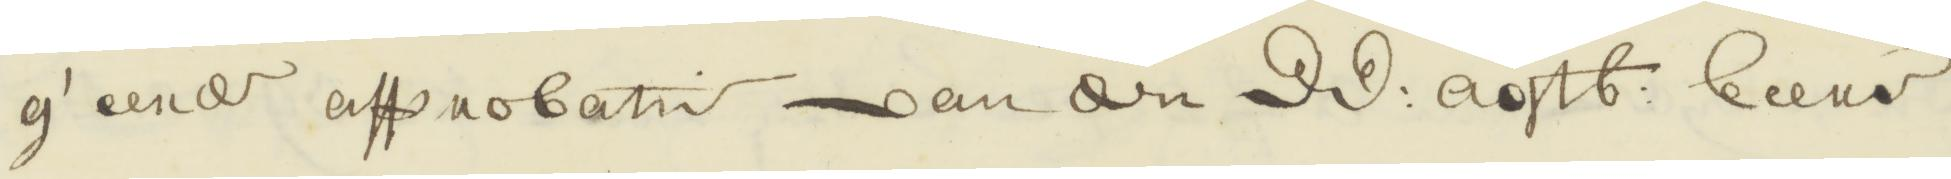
g’eerde approbatie van den EE: agtb: heere
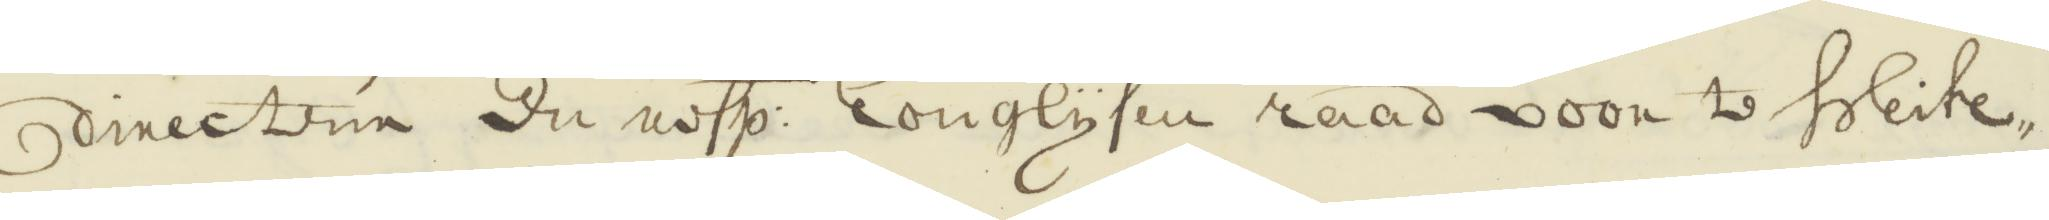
directeur En resp: houglijsen raad voor te schik„
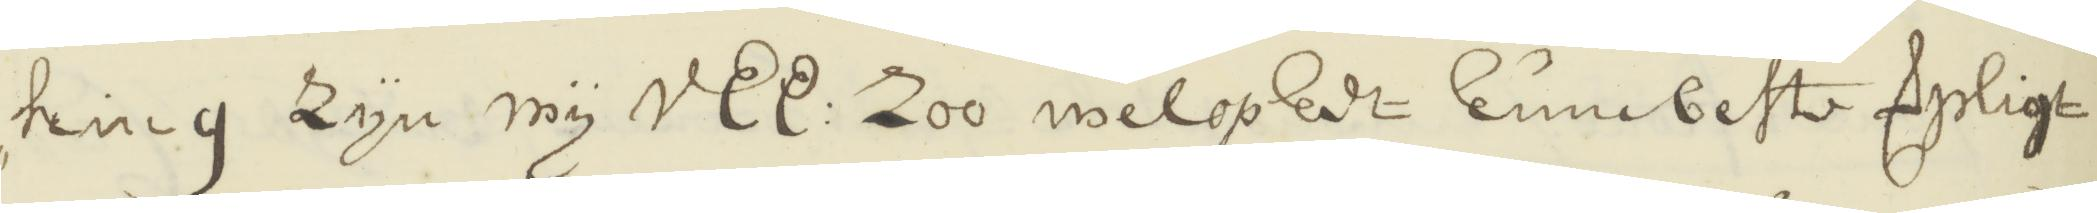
„king zijn wij UEE: zoo wel op het hun beste verpligt
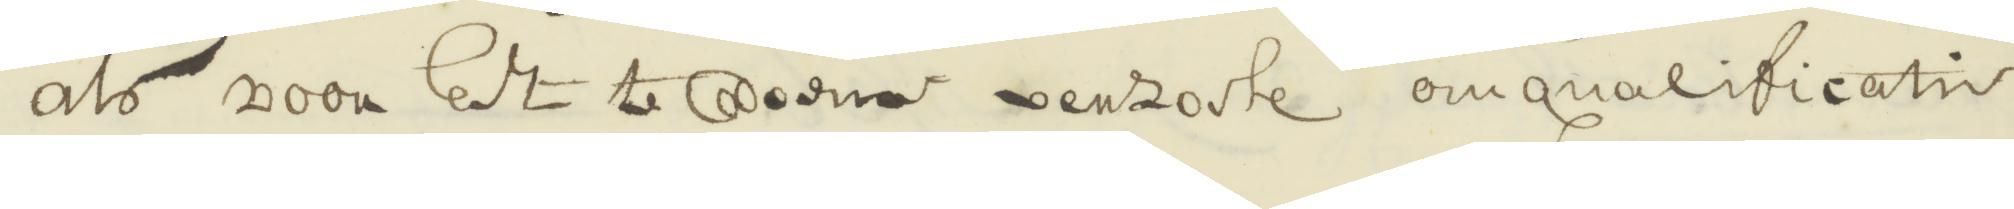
als voor het te doene verzoek om qualificatie
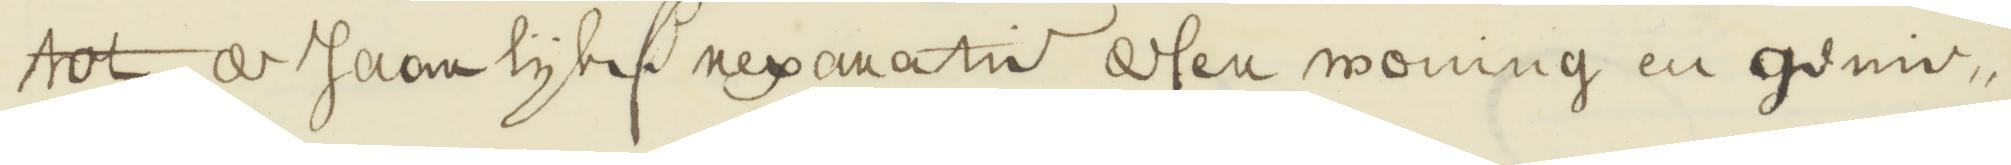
tot de Jaarlijkse reparatie deser woning en genie„
